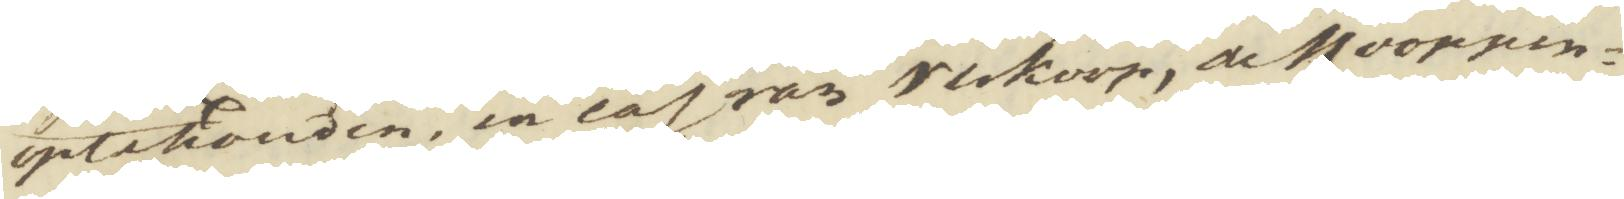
optehouden, in cas van verkoop, de kooppen=
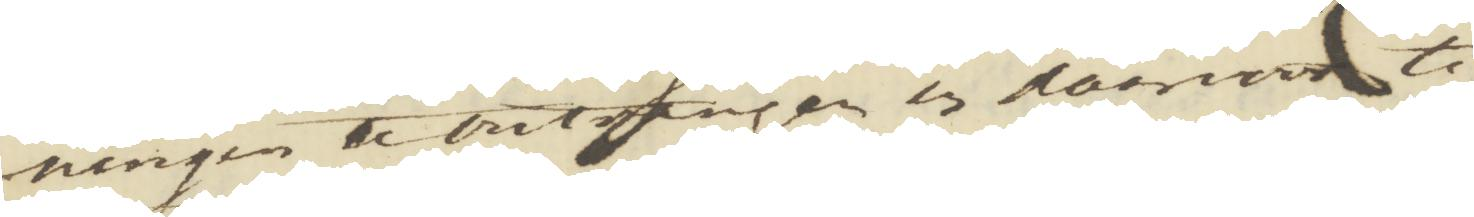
ningen te ontvangen en daarvoor te
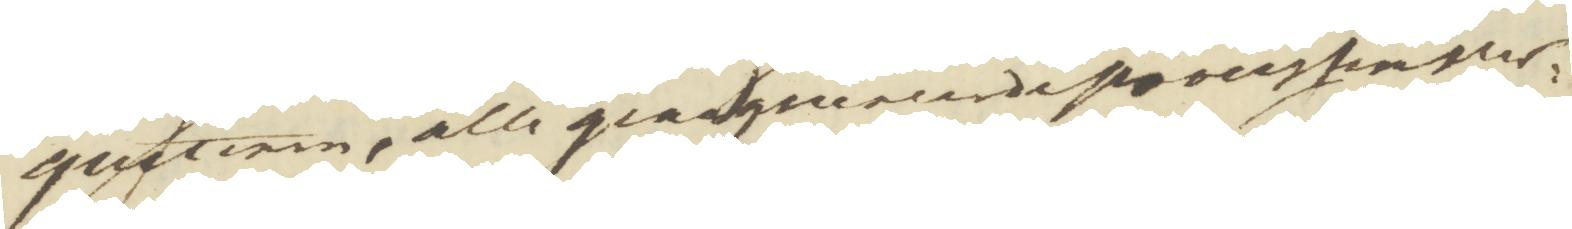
quiteren, alle gerequireerde processen ver:
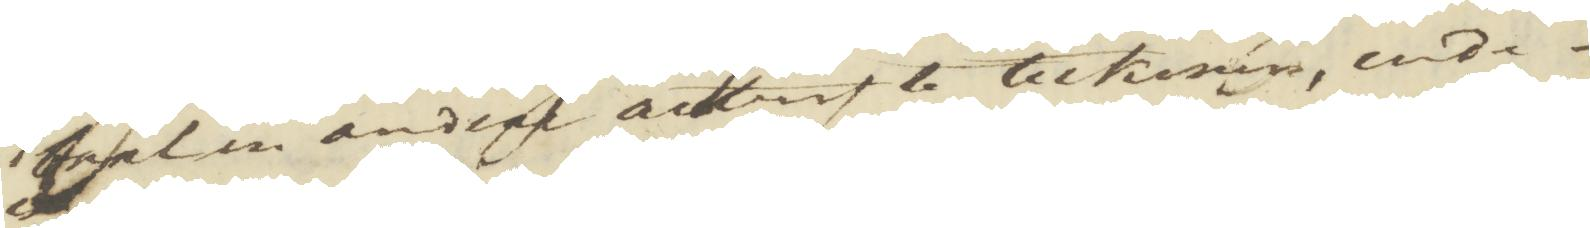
baal en andere actens te teekenen, ende
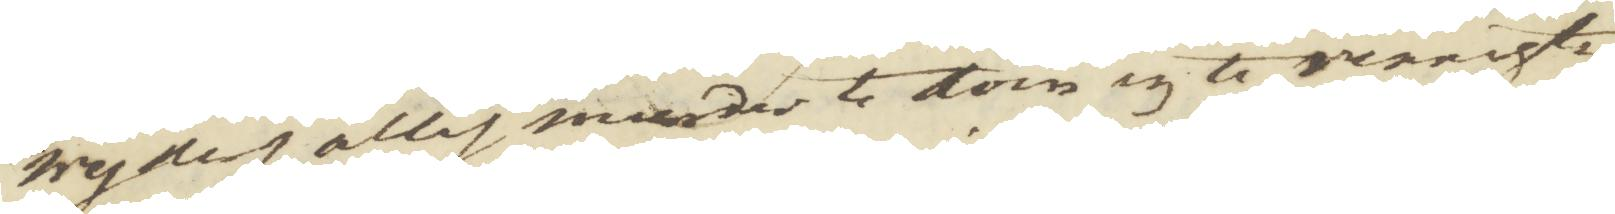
wyders alles meerder te doen en te verrigten
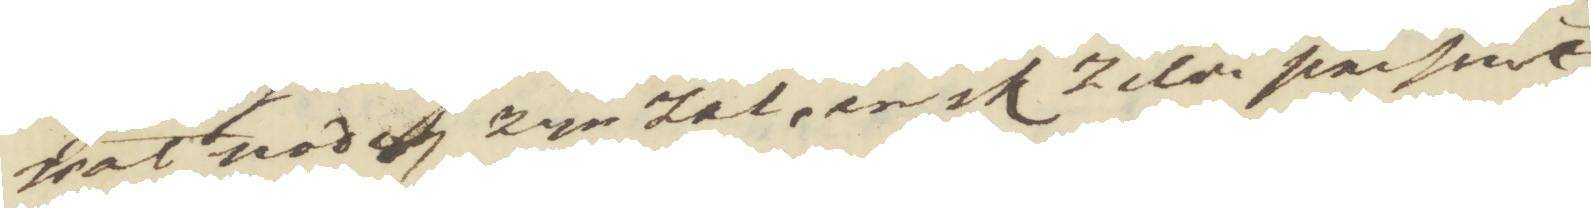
wat nodig zyn zal, en ik zelve present
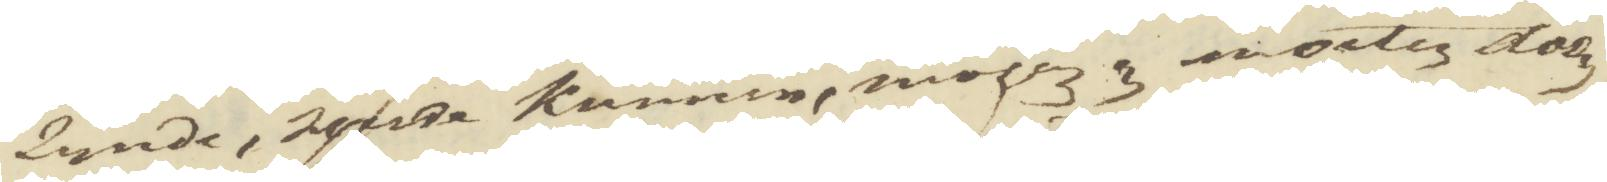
zynde, zoude kunnen, mogen en moeten doen,
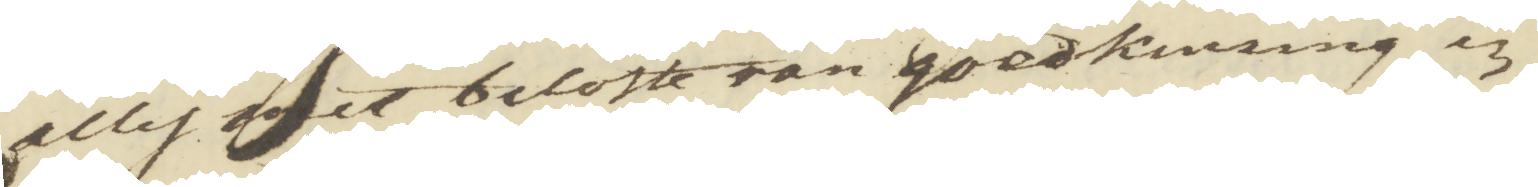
alles met belofte van goedkeuring en
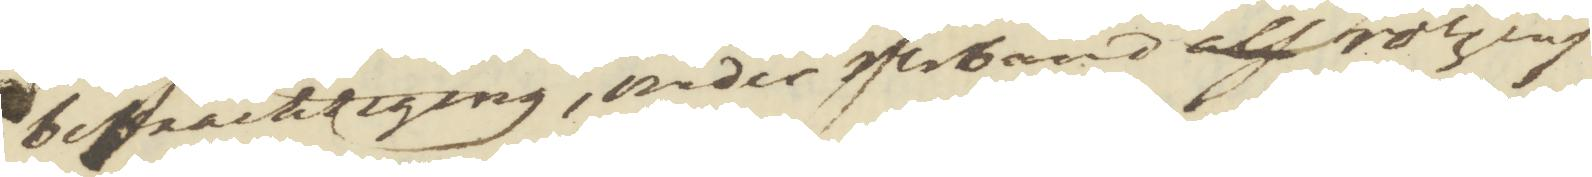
bekrachtiging, onder verband als volgens
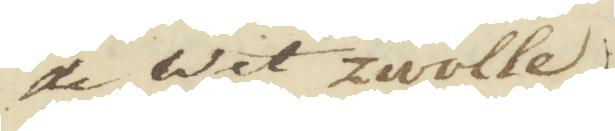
de wet zwolle.
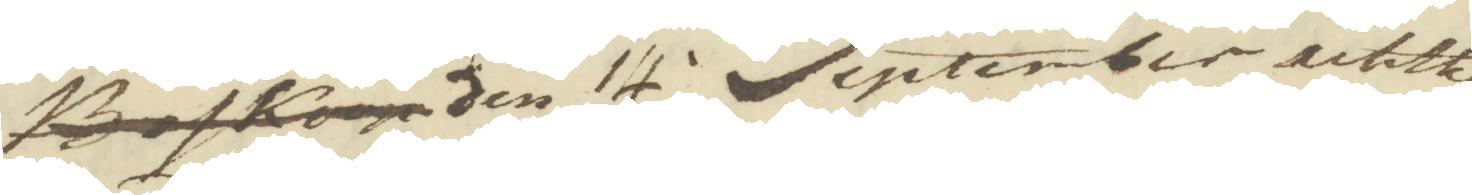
Boskoop den 14' September achtien
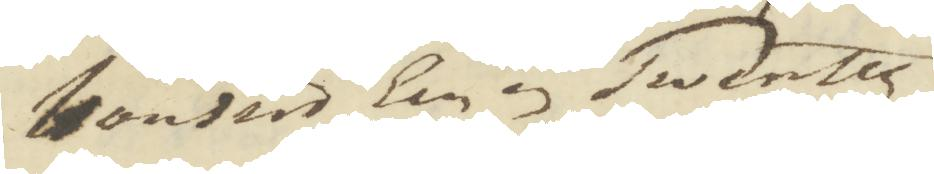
honderd Een en twintig
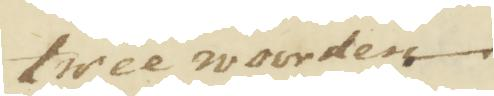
twee woorden
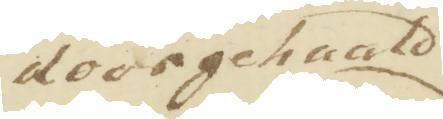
door gehaald
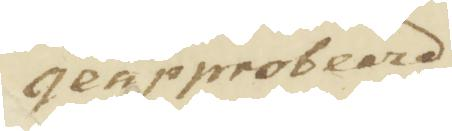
geapprobeerd
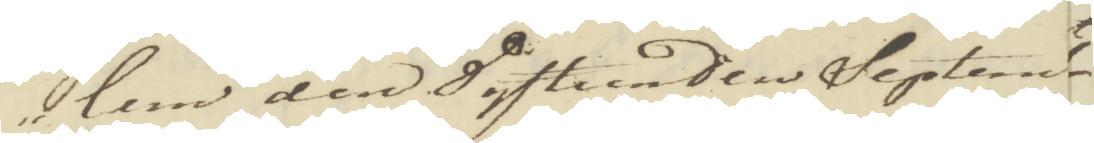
„lem den Vyftienden Septem
